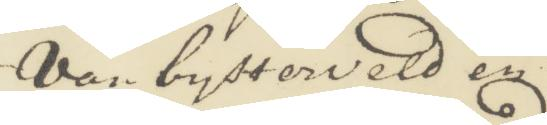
van bysterveld en
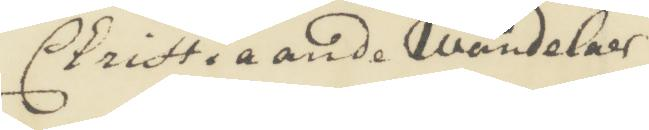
Christiaan de Wandelaer
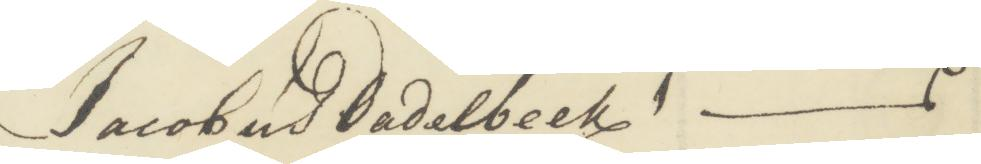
Iacobus dadelbeek 1 _o
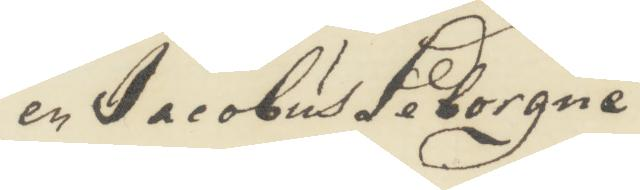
en Iacobus Leborgne
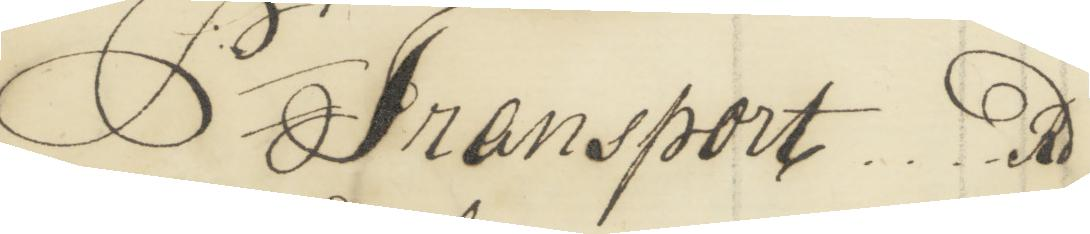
P=r Transport - - - - Rd
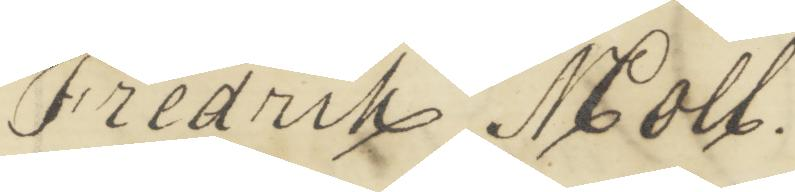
Fredrik Moll.
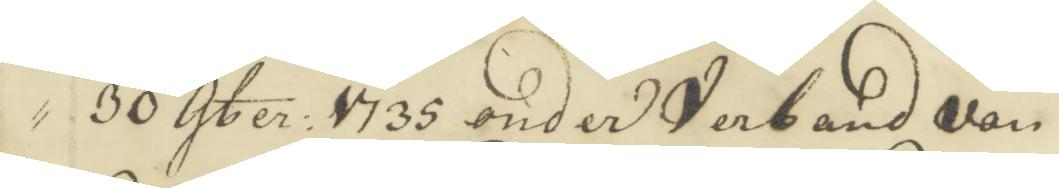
„ 30 Gber: 1735 onder Verband van
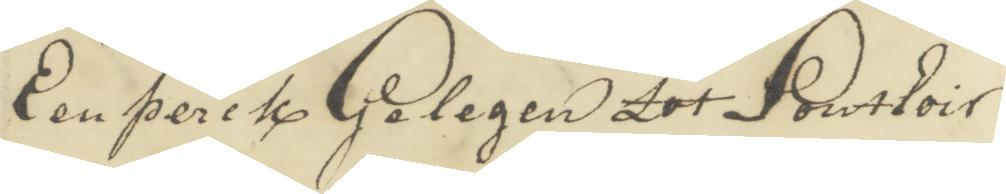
Een perck Gelegen tot Ponthoir
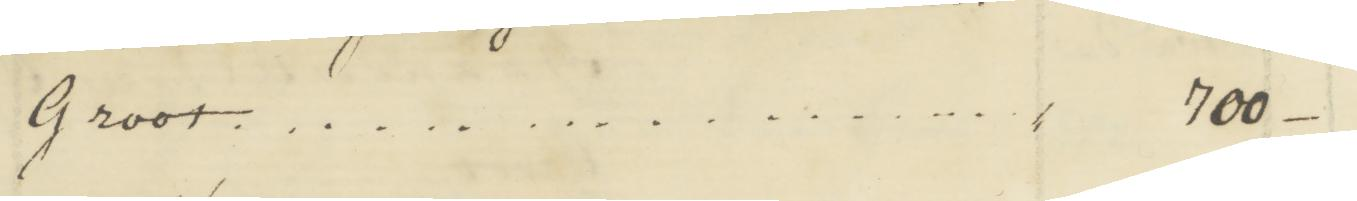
Groot . . . . . . . . . . . . . . . . . . „ 700 —
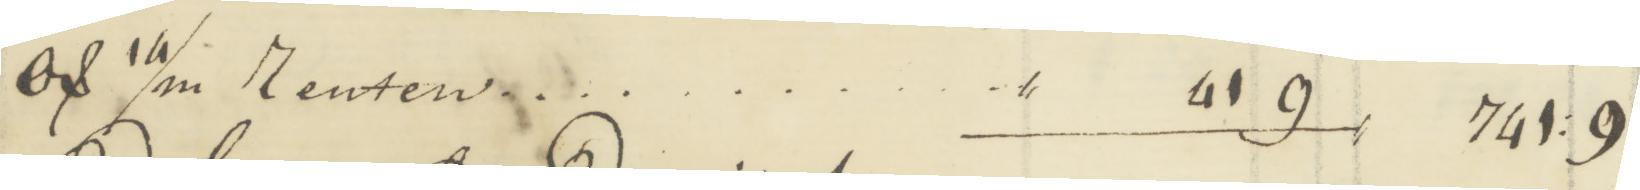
over 14/m renten . . . . . . . . . . . „ 41 9 „ 741: 9
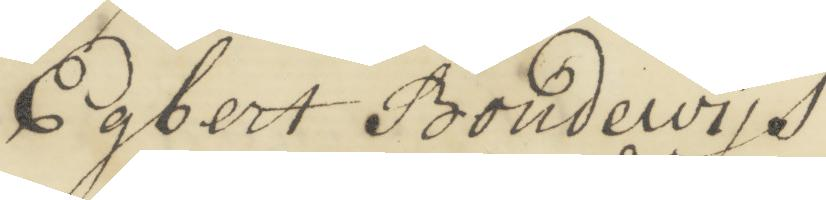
Egbert Boudewijs
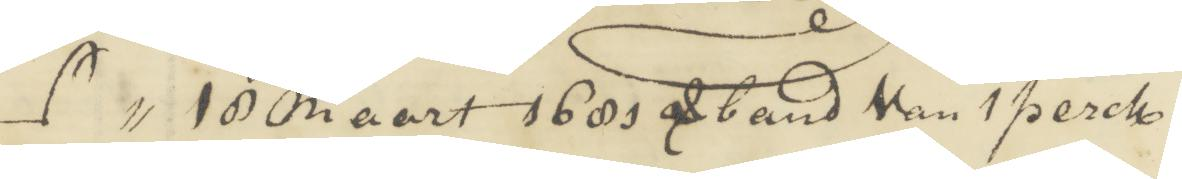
_o „ 18 maart 1681 verband van 1 perck
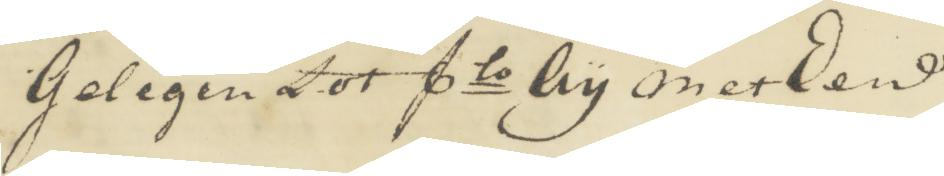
Gelegen tot p=lo liij met Een
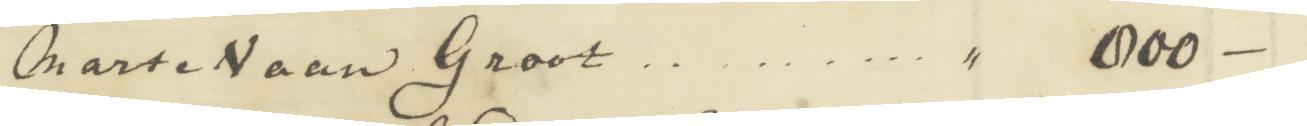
marte Vaar Groot . . . . . . . . . „ 800 —
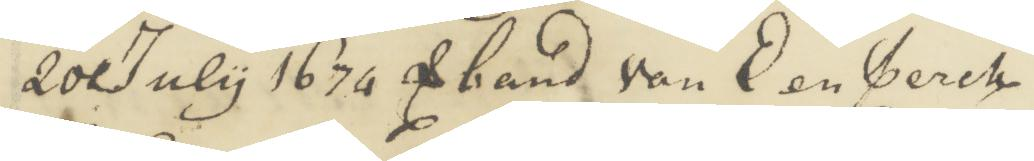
20 Iulij 1674 verband van Een perck
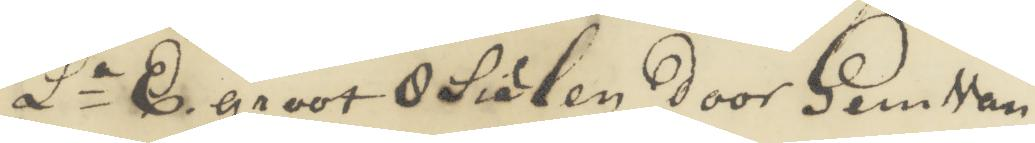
L=r E. groot 8 Sielen door hem van
